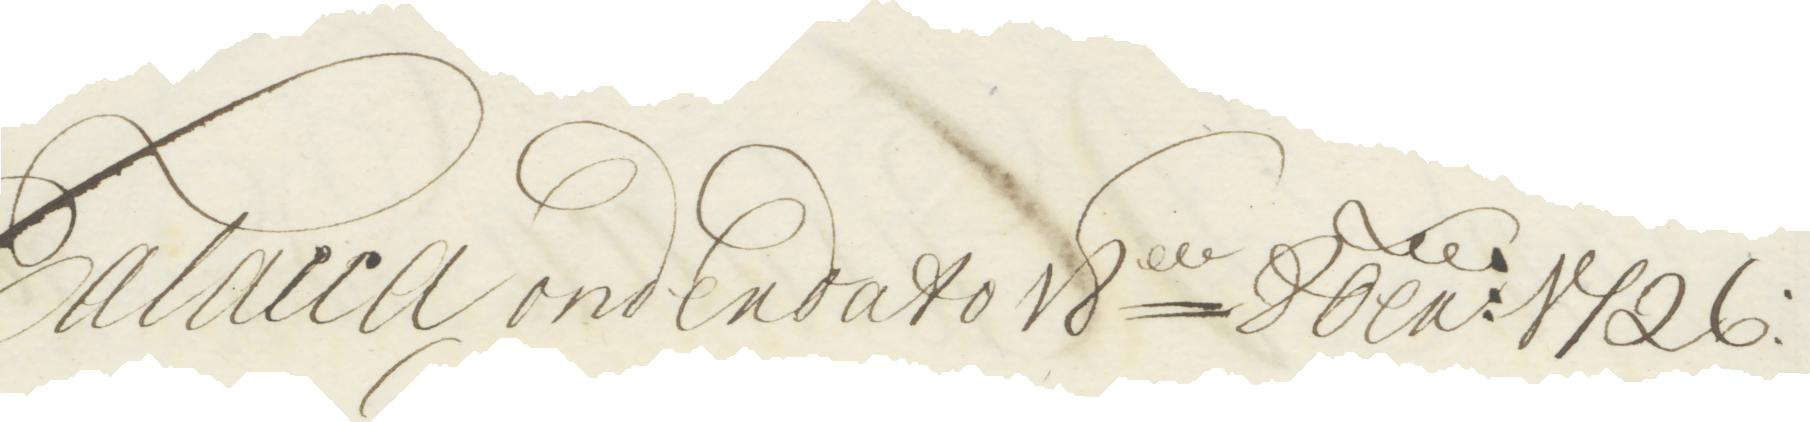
Van Malacca onder dato 18=de 8ber: 1726:
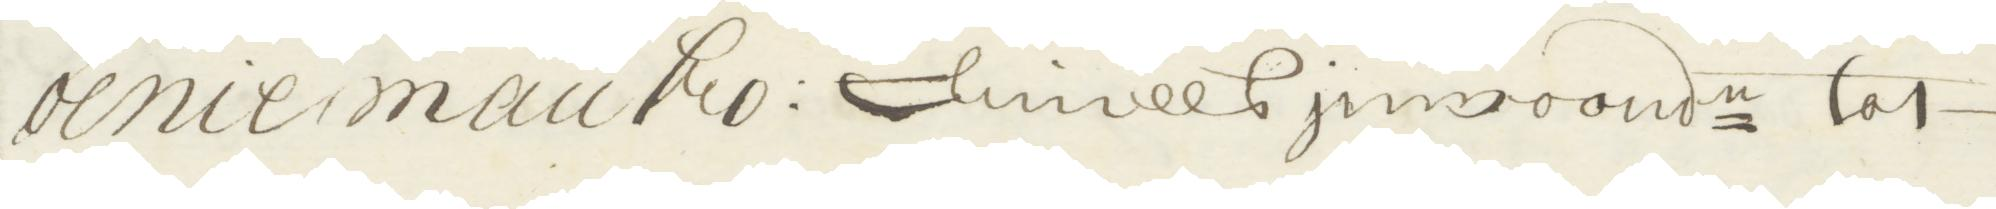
den 8„e ijulij oenie manko: Chinees jnwoond=r tot
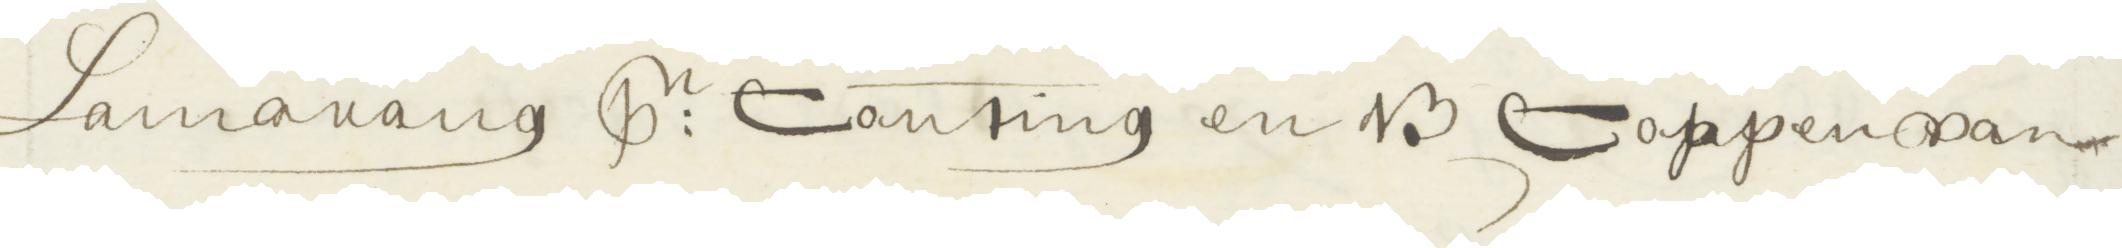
Samarang p:r Conting en 13 Coppen van
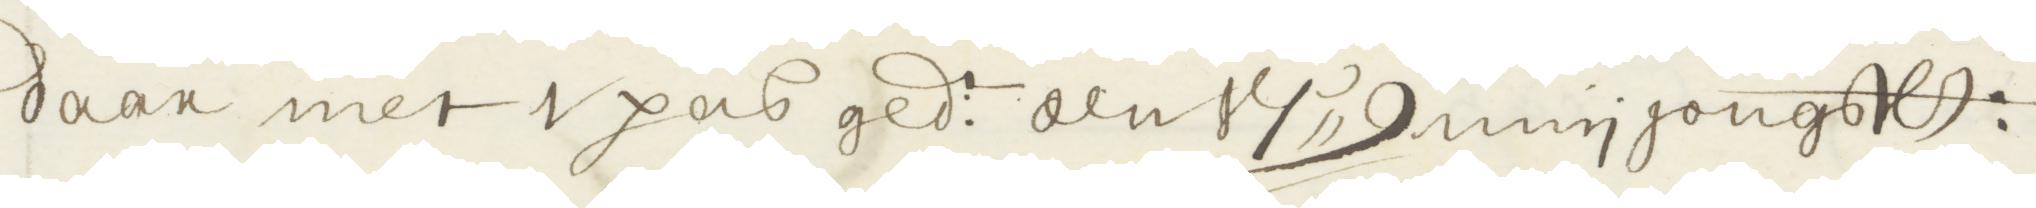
daar met 1 pas ged:t den 17„' junij jongstlijk
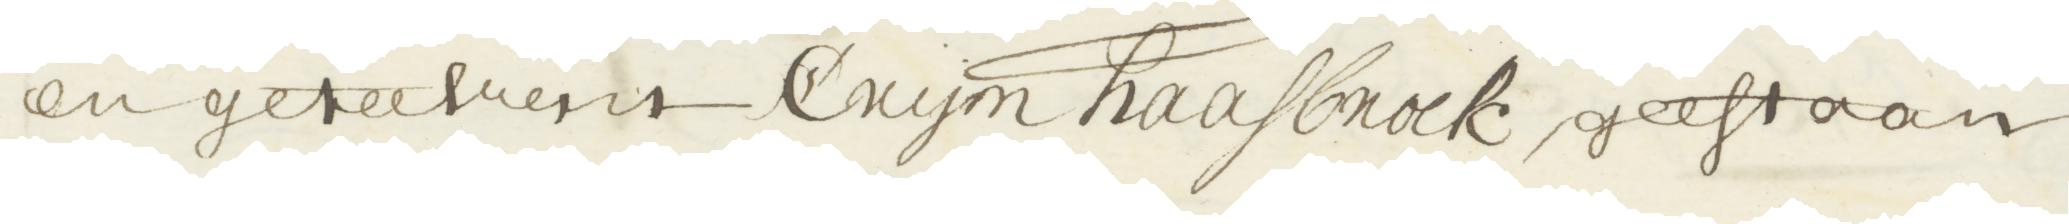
en geteekent Crijn haasbroek, geeft aan
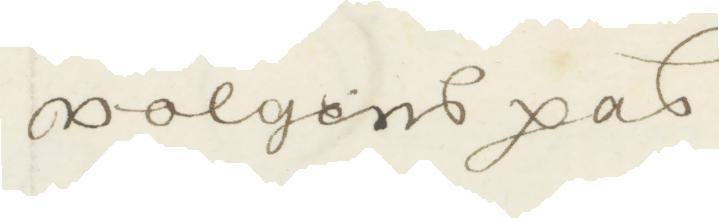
volgens pas
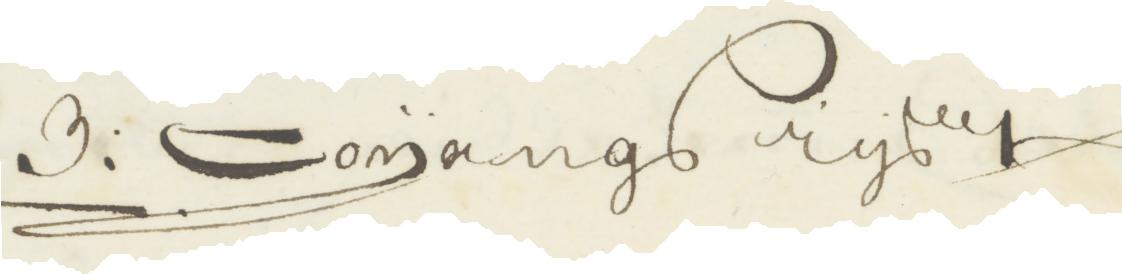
3: Coijangs rijst
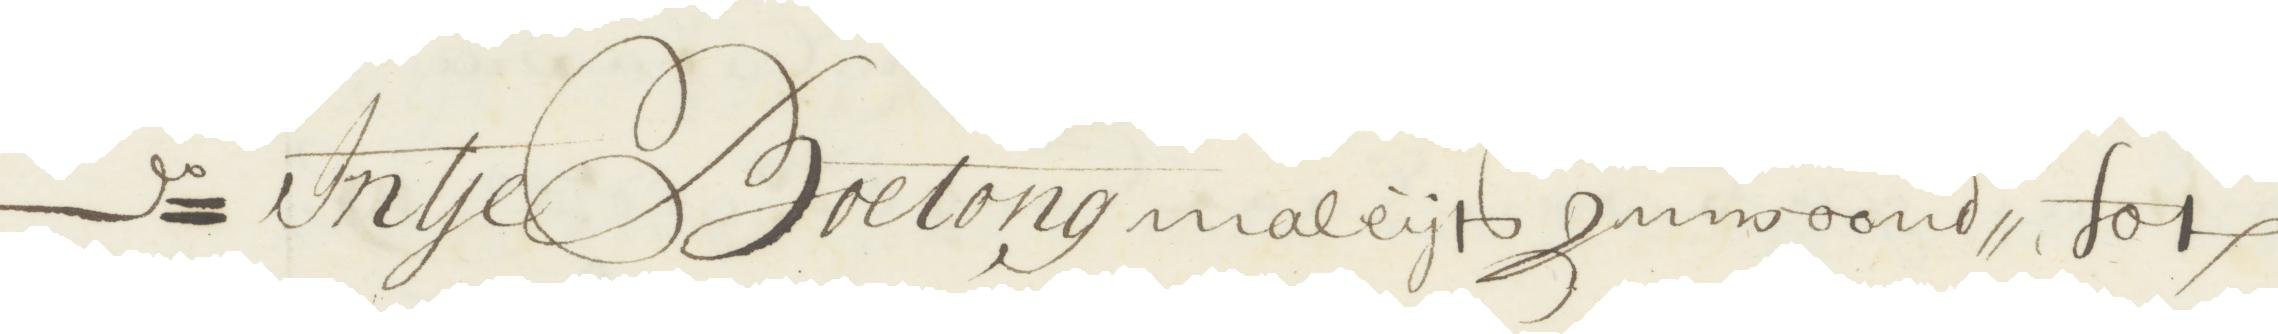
9„en _=o Jntje Boetong maleijt jnwoond„r tot
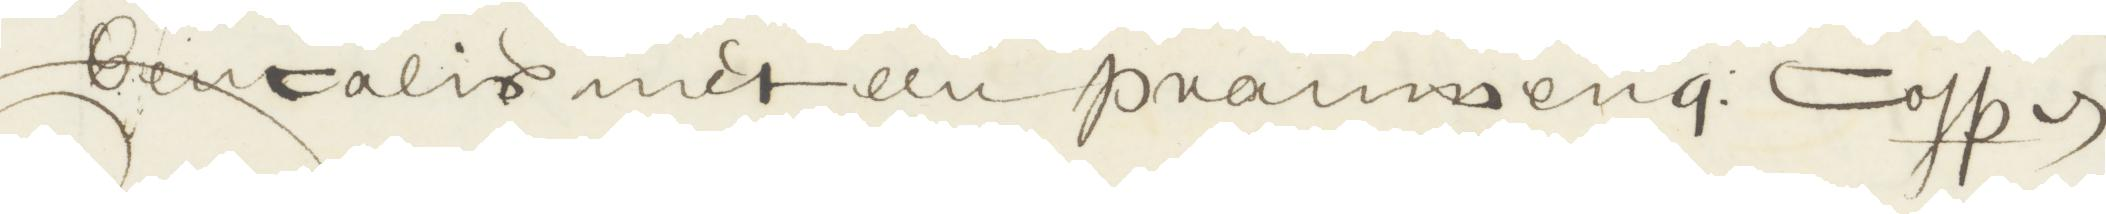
bencalis met een prauw en 4: Coppen
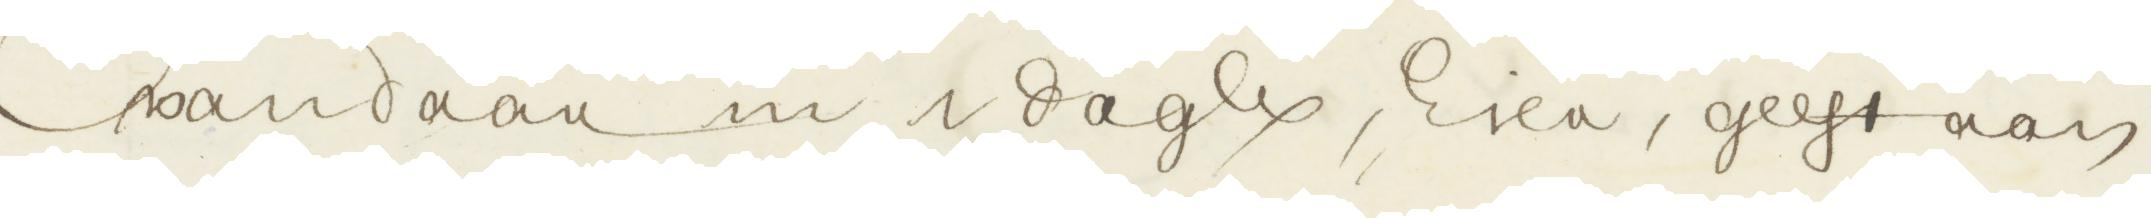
vandaar in 1 dagh, hier, geeft aan
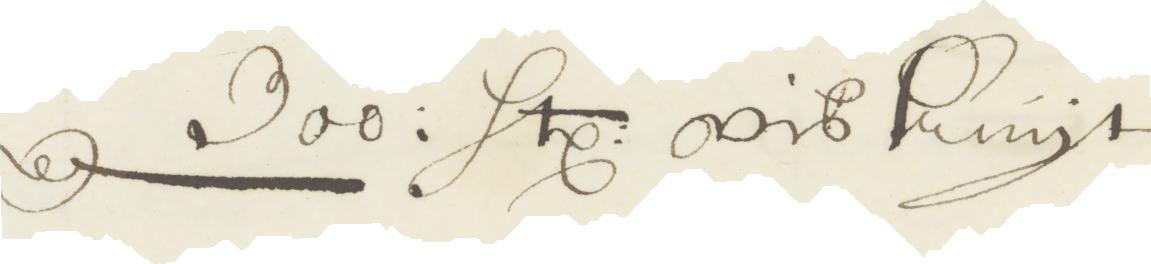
300: stx: vis kuijt
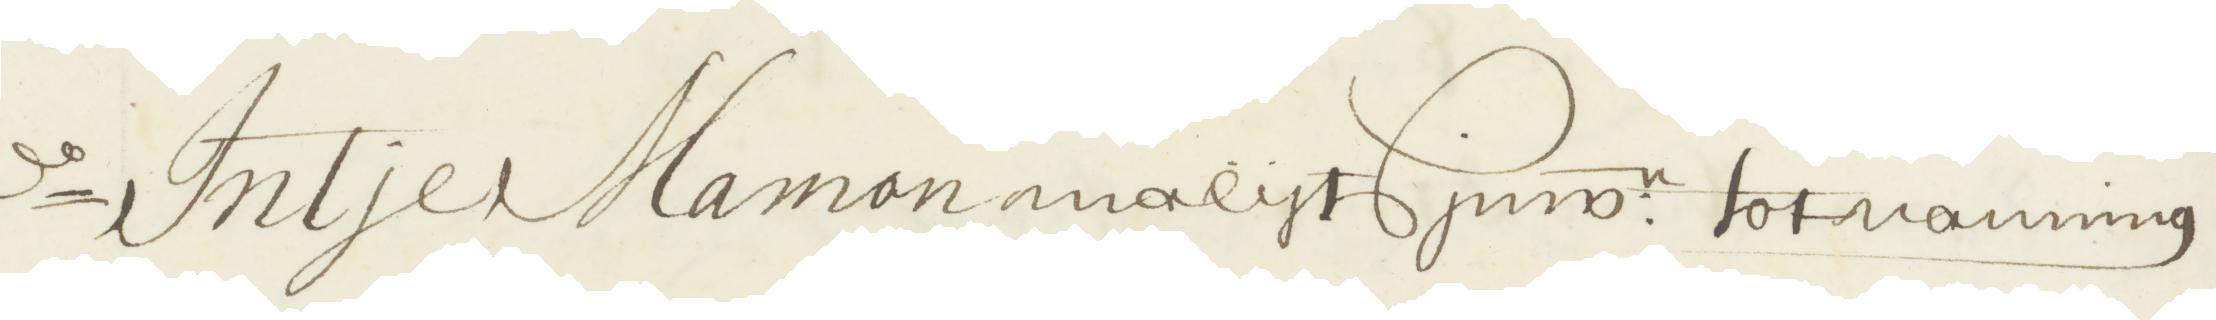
„ „ d=o Jntje Mamon malijts jnw:r tot nanning
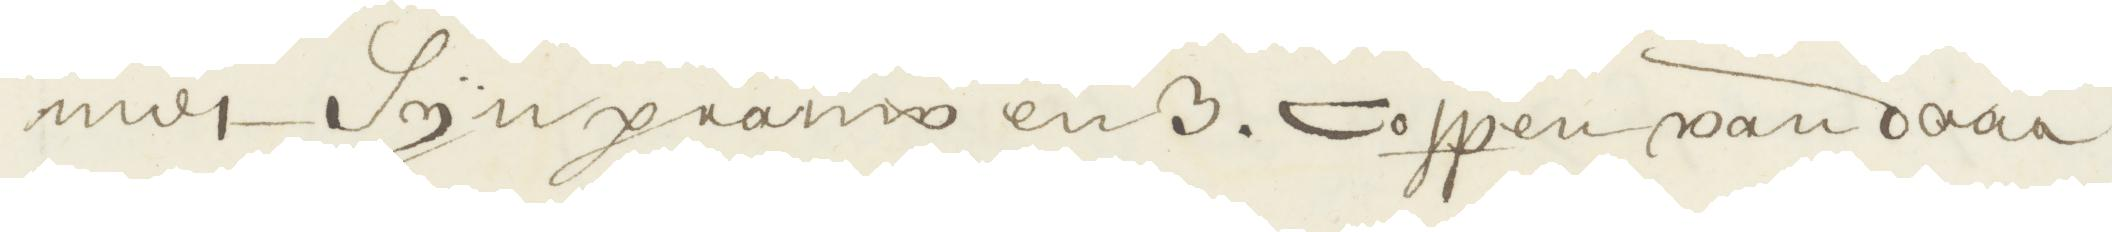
met sijn prauw en 3. Coppen van daar
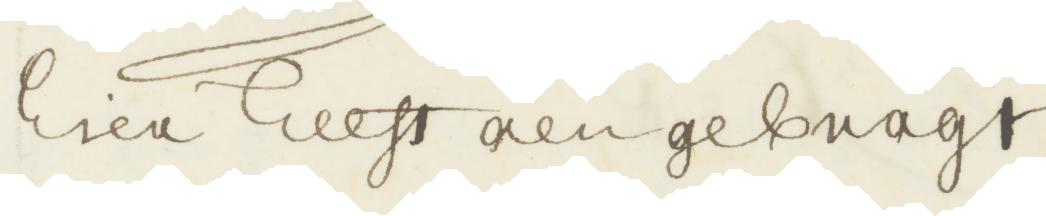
hier heeft aen gebragt
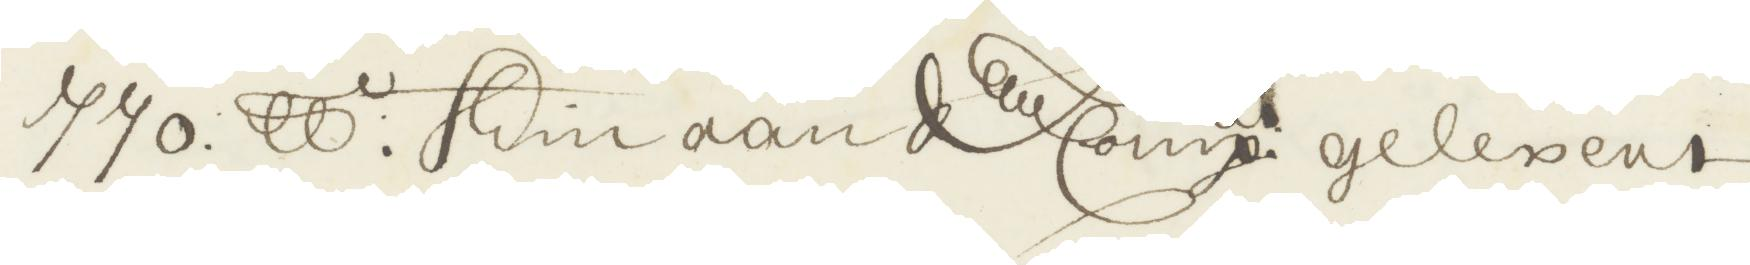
770: lb: thin aan dE Comp: gelevert
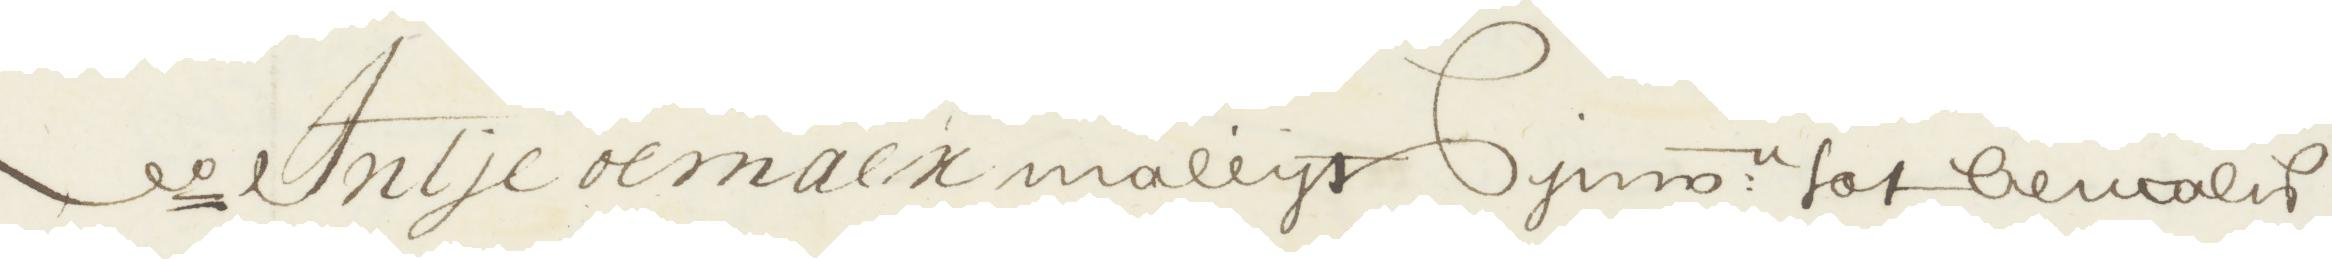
10: _=o Jntje oemaer maleijts jnw:r tot bencalis
